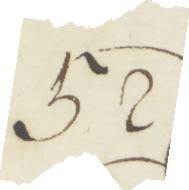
528
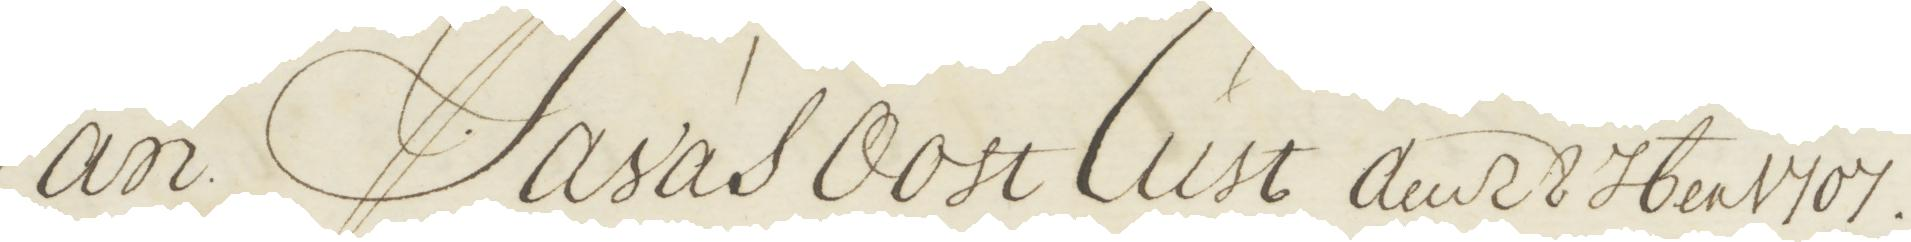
Van Java's Oost Cust den 28 7ber 1707.
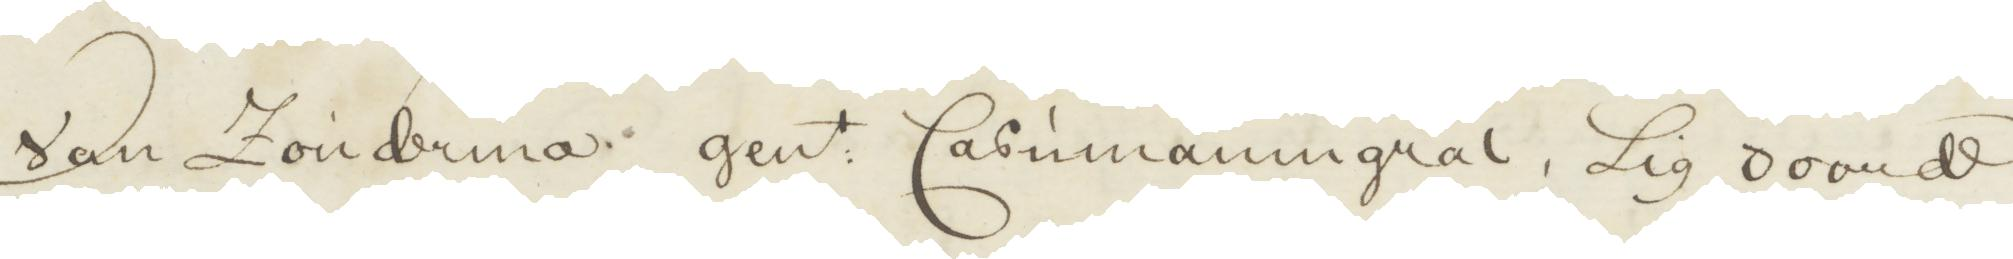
van Zouderma gen:t Casumaningrat, sig door de
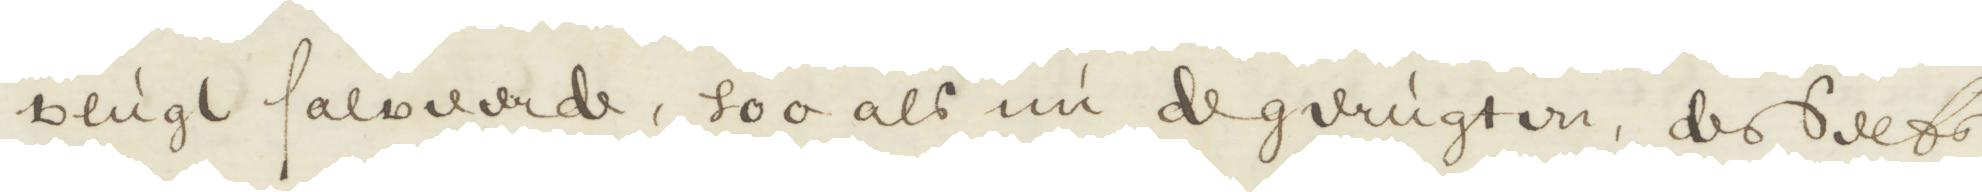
vlugt salveerde, soo als nu de gerugten, desselfs
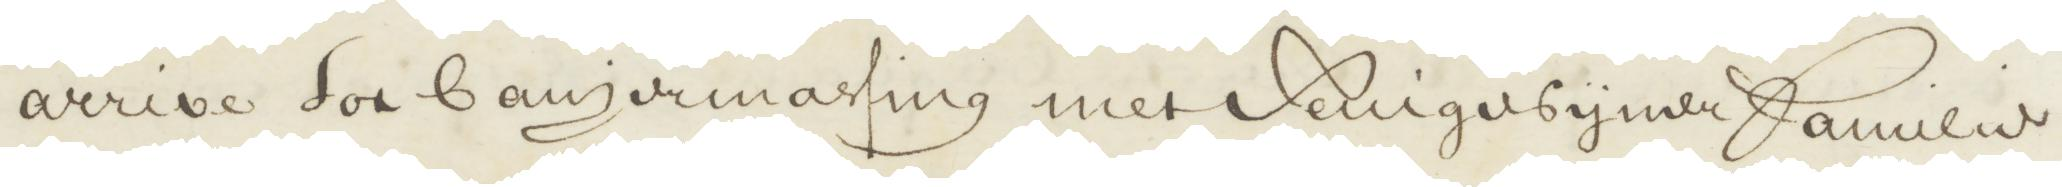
arrive tot banjermassing met Eenige sijner familie
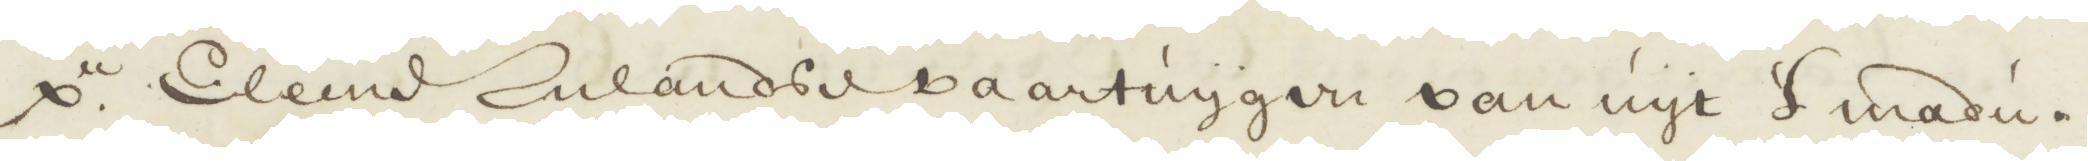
p:r Cleene jnlandse vaartuijgen van uijt 't madu„
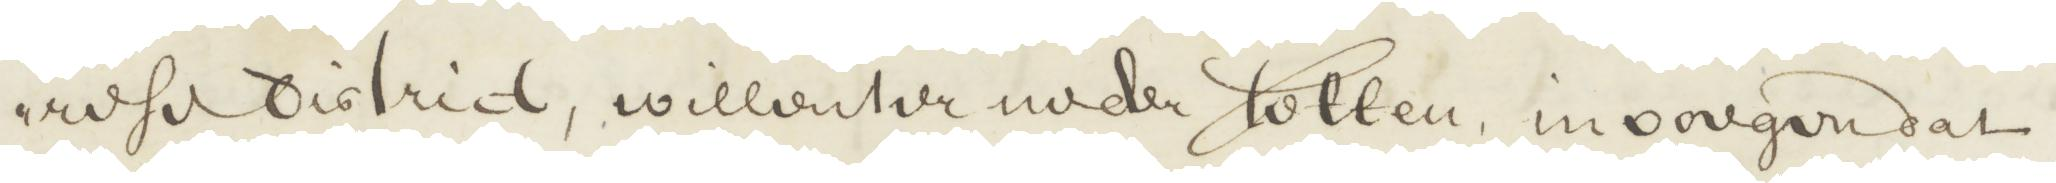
„rese district, willen ter neder stellen, in voegen dat
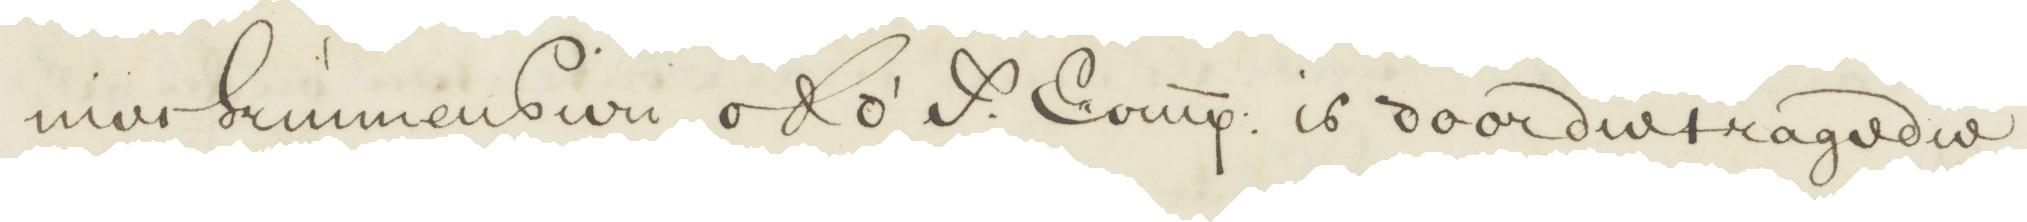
niet kunnen sien of d’E. Comp: is door die tragedie
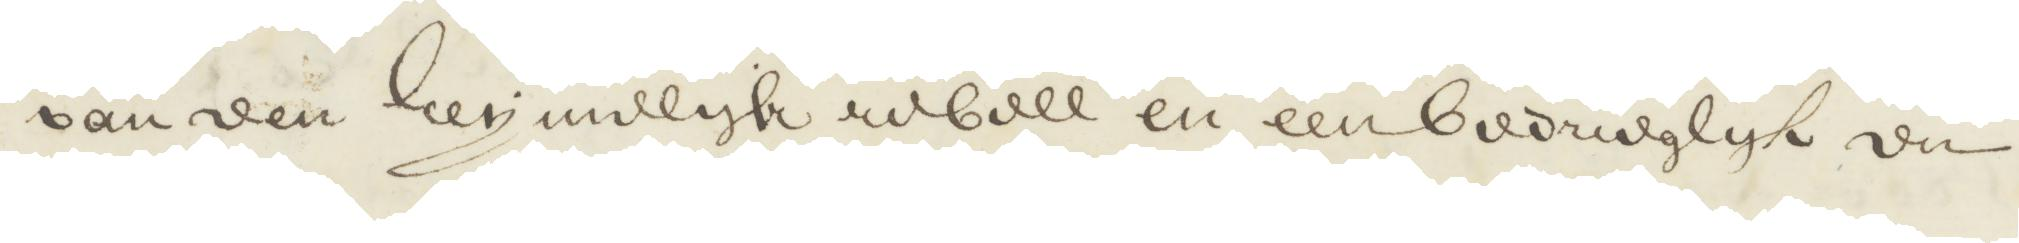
van een heijmelijk rebell en een bedrieglijk en
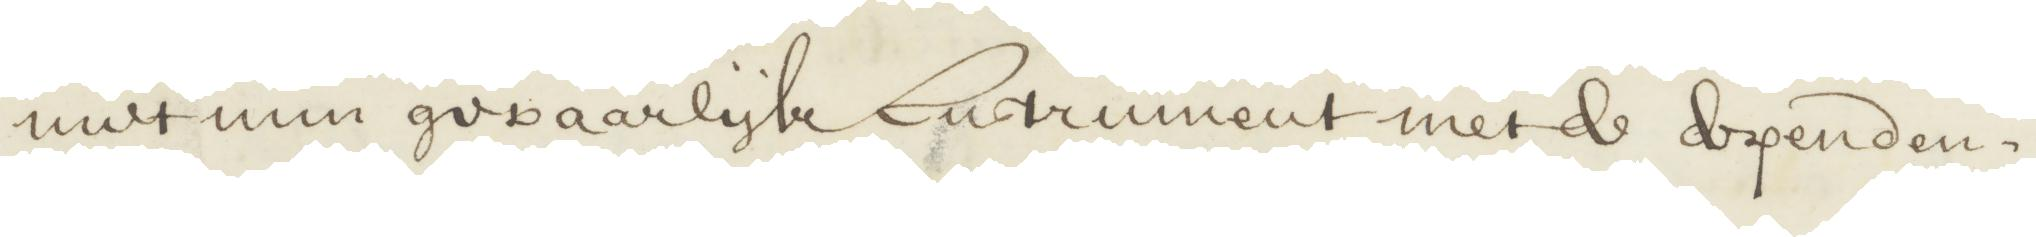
niet min gevaarlijk jnstrument met de dependen-
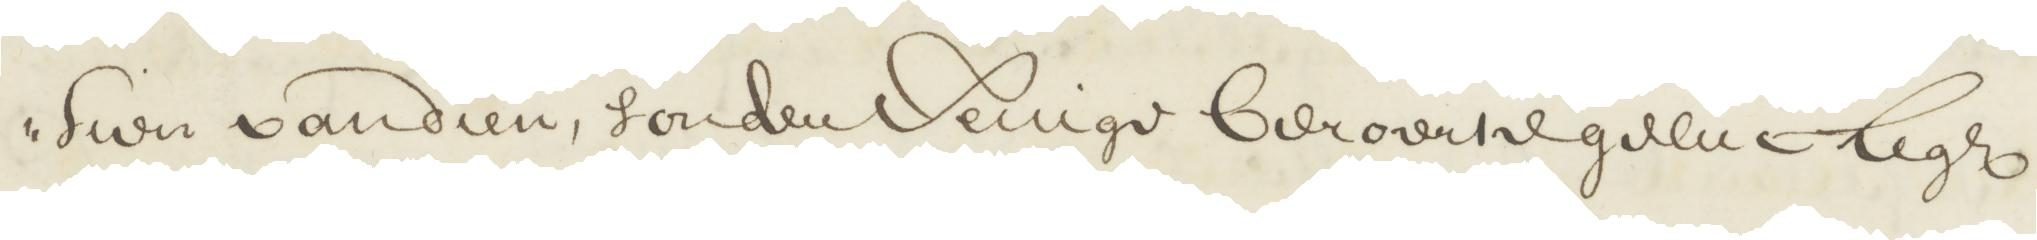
„tien van dien, souder Eenige beroerte geluckegh
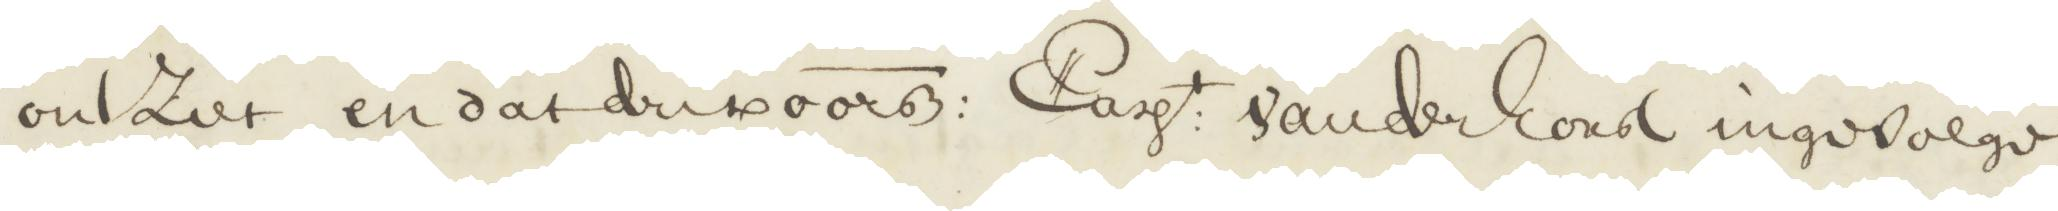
ontzet en dat den voorsz: Cap:t van der horst ingevolge
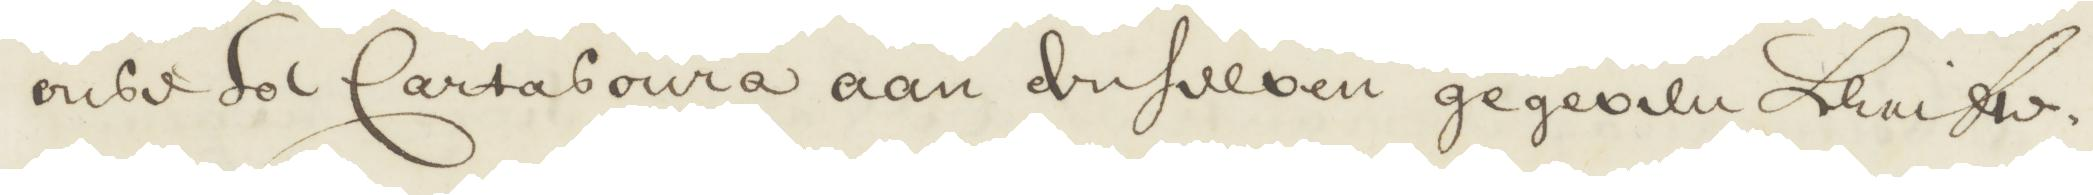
onse tot Cartasoura aan denselven gegeven schrifte„
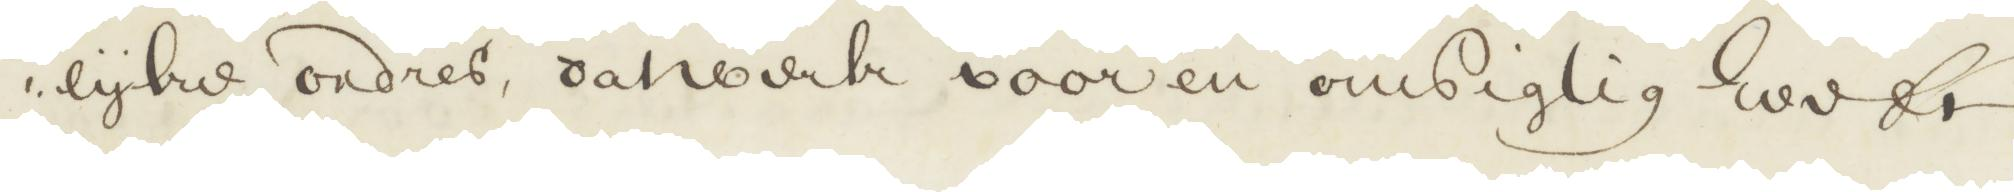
„lijke ordres, dat werk voor en omsigtig heeft
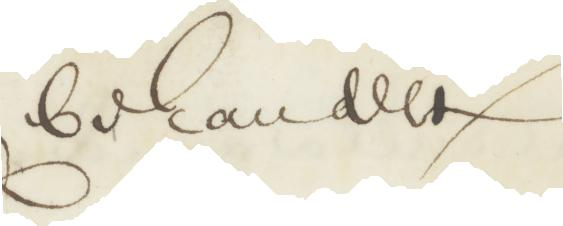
behandelt
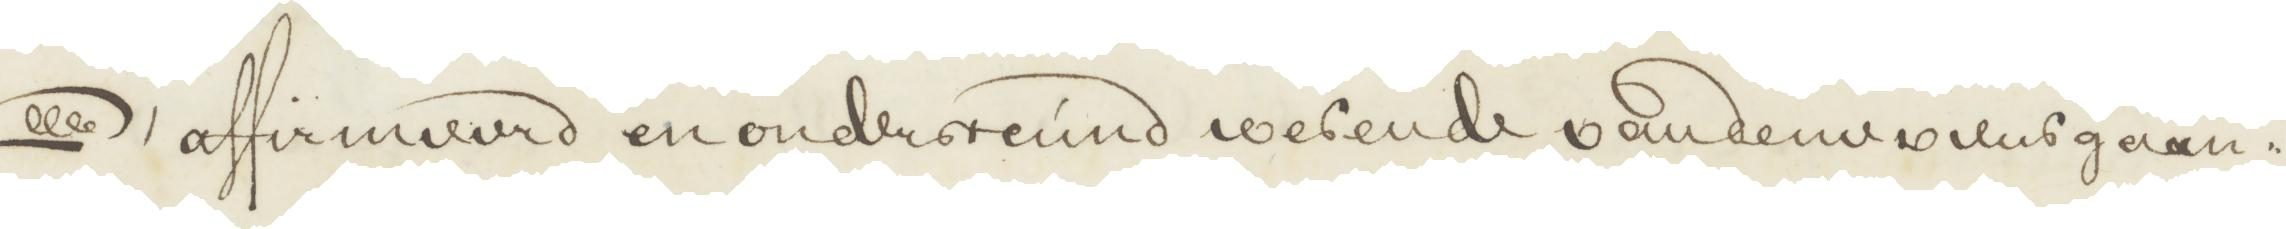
G'affirmeerd en ondersteund wesende van de nevens gaan„
